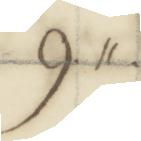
9. „
